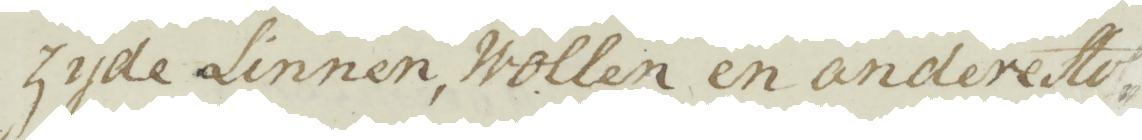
zyde Linnen, wollen en andere stof„
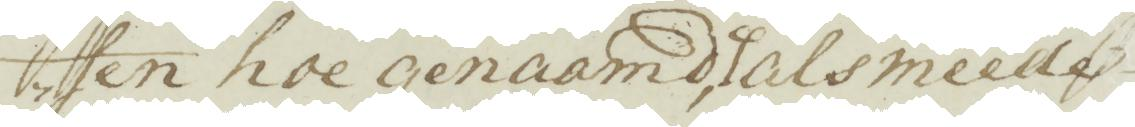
fen hoe genaamd, ¶ als meede
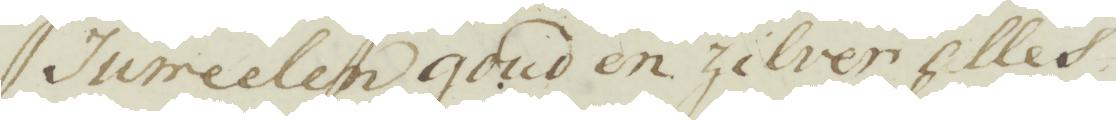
Iuweelen, goud en zilver alles
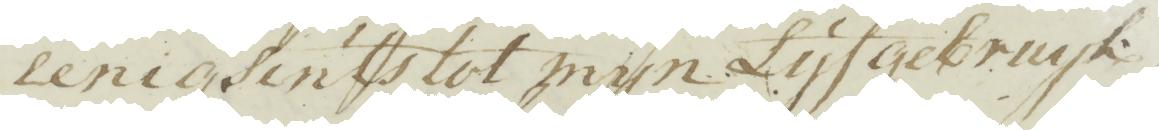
eenigsints tot myn Lijfgebruyk
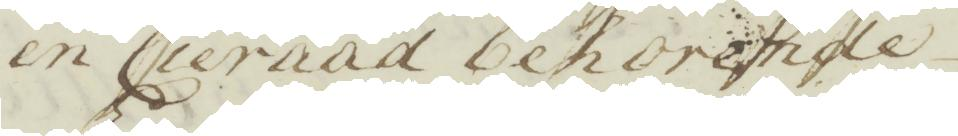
en Cieraad behorende
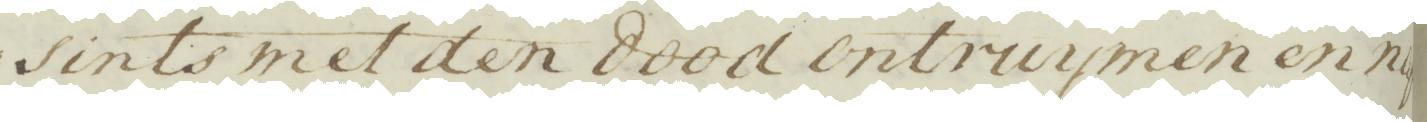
sints met den dood ontruymen en n
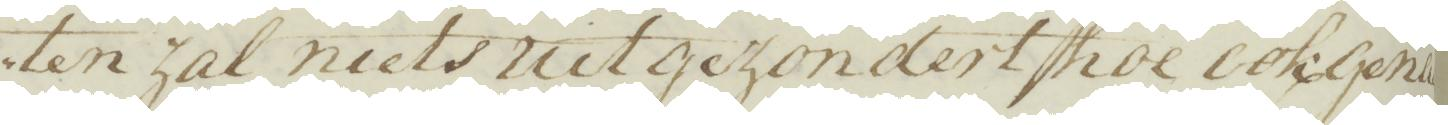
ten zal, niets uitgezondert hoe ook gene
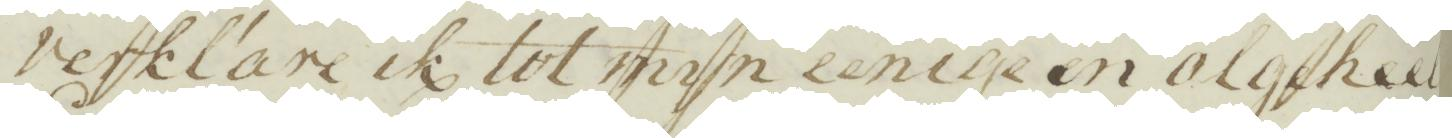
verklare ik tot myn eenige en algeheel
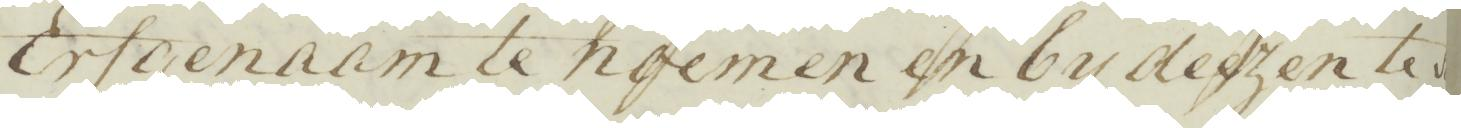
Erfgenaam te noemen en by deezen te
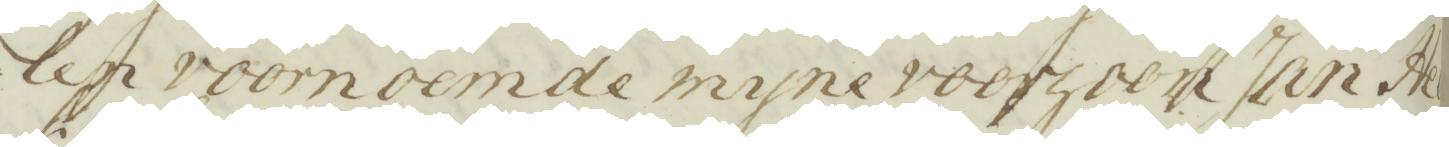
len voornoemde myne voorzoon Jan He
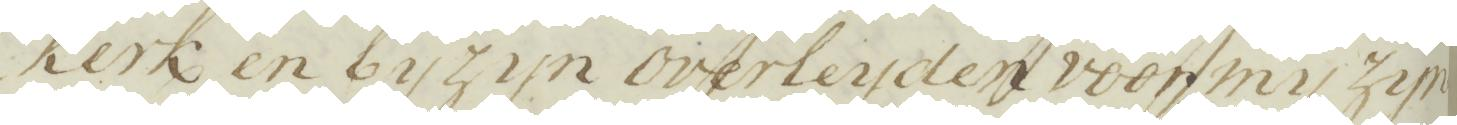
kerk, en by zyn overleyden voor my, zyn
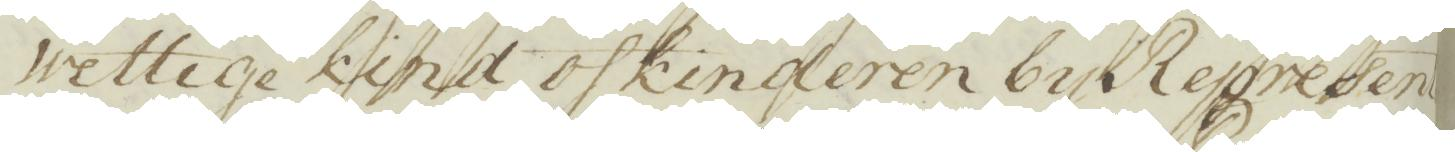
wettige kind of kinderen by Represent
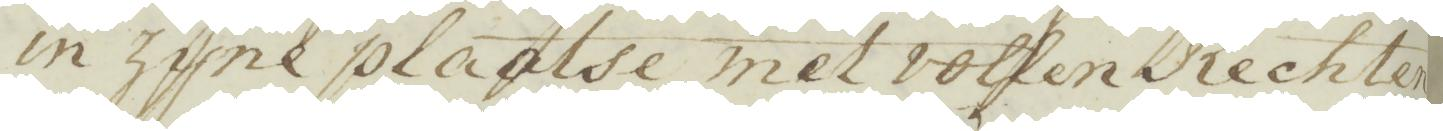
in zyne plaatse, met vollen Rechten
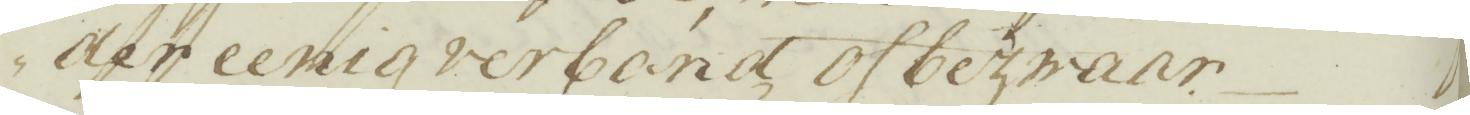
„ der eenig verband of bezwaar. -
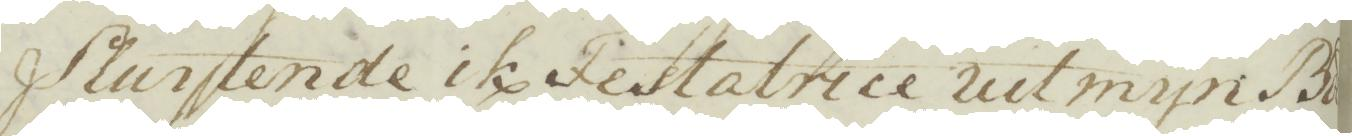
Sluytende ik Testatrice uit myn B
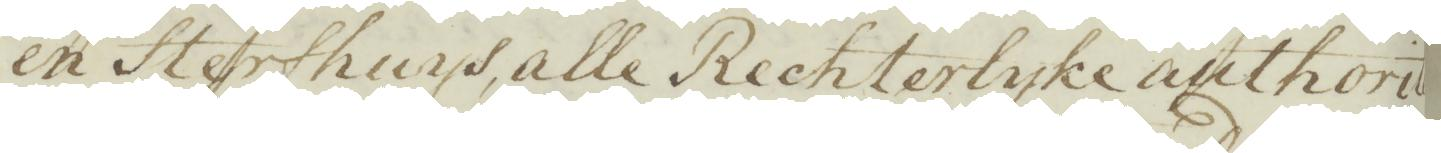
en Sterfhuys, alle Rechterlyke authori
